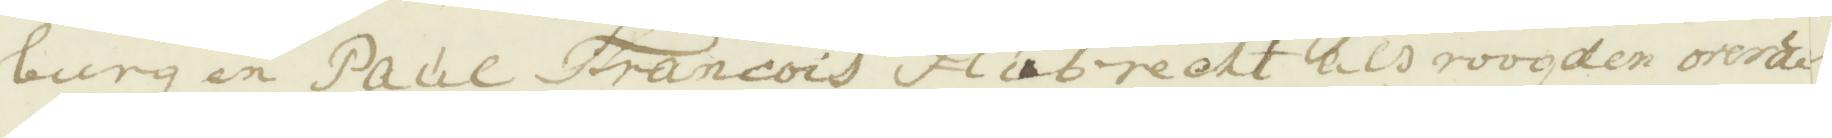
burg en Paul Francois Hubrecht, als voogden over de
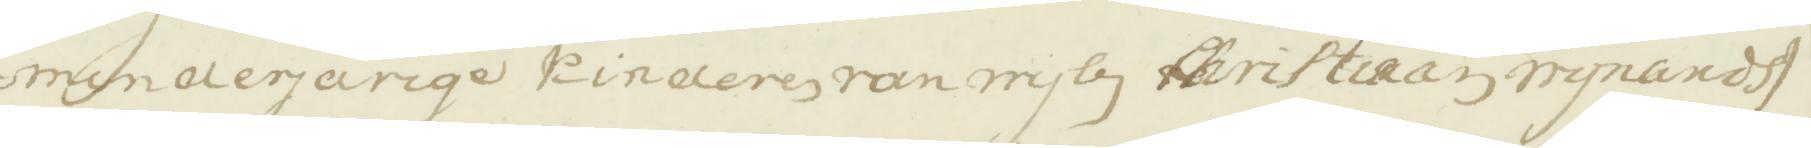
minderjarige Kinderen van wijlen Christiaan wijnands
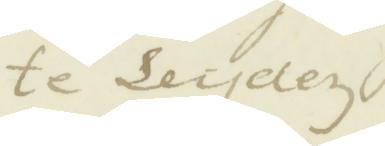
te Leijden
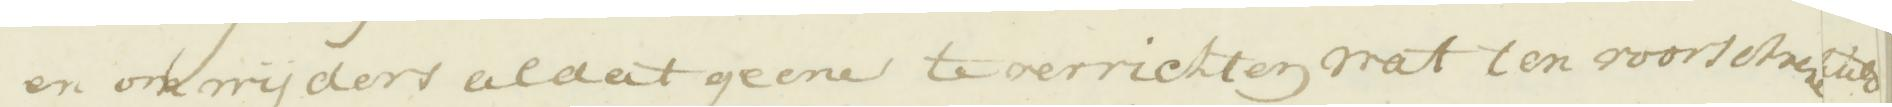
en om wijders aldat geene te verrichten wat ten voorschreve
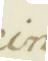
einde
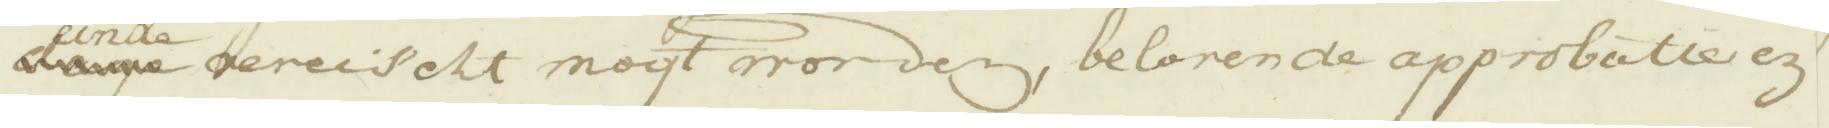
dage vereischt mogt worden, belovende approbatie en
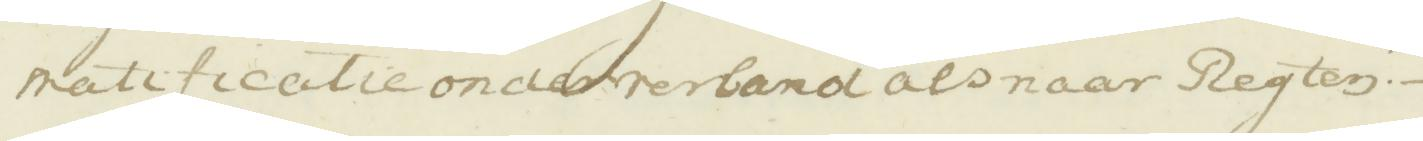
ratificatie onder verband als naar Regten.
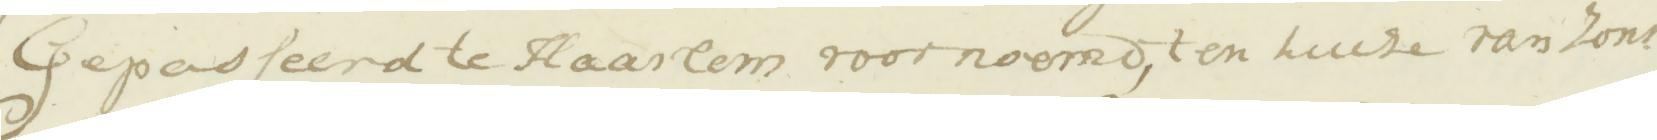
Gepasseerd te Haarlem voornoemd, ten huize van Jonk
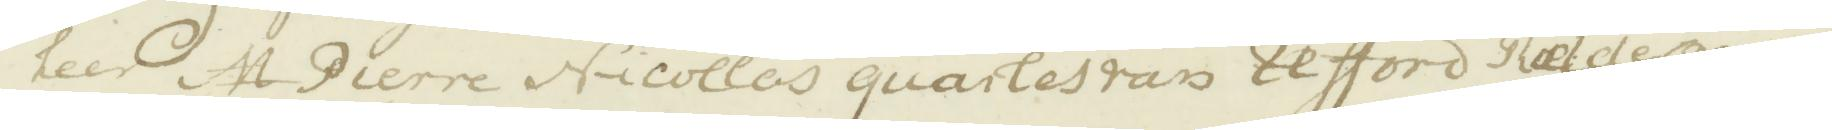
heer M Pierre Nicollas quarles van Ufford Ridder van de
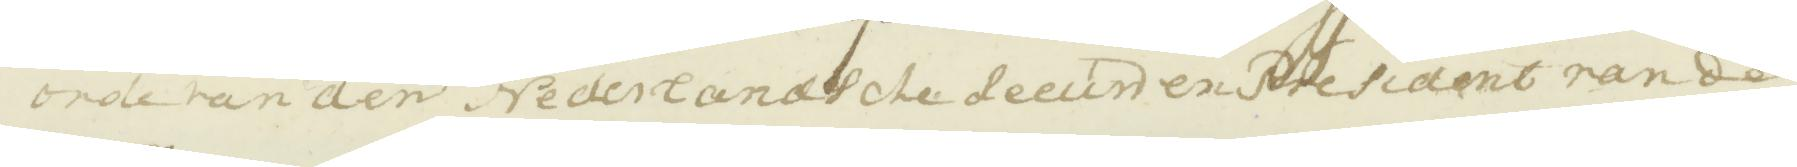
orde van den Nederlandsche Leeuw en President van de
